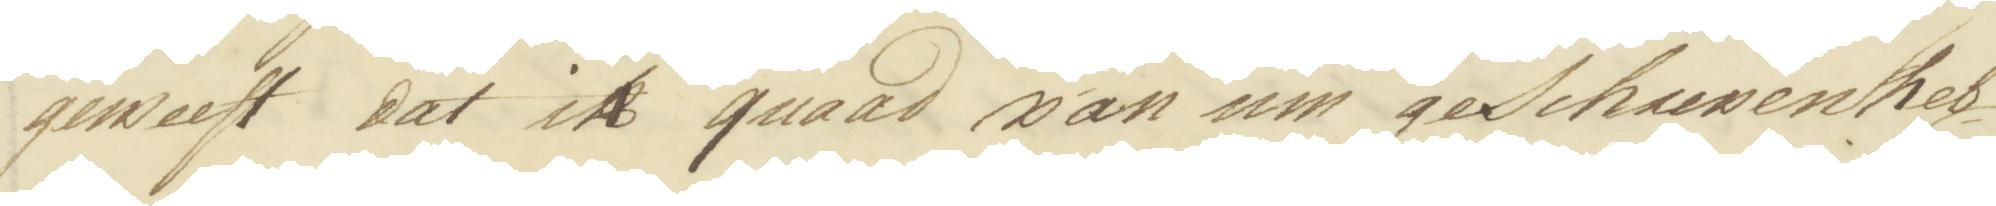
geweest dat ik quaad van uw geschreven heb
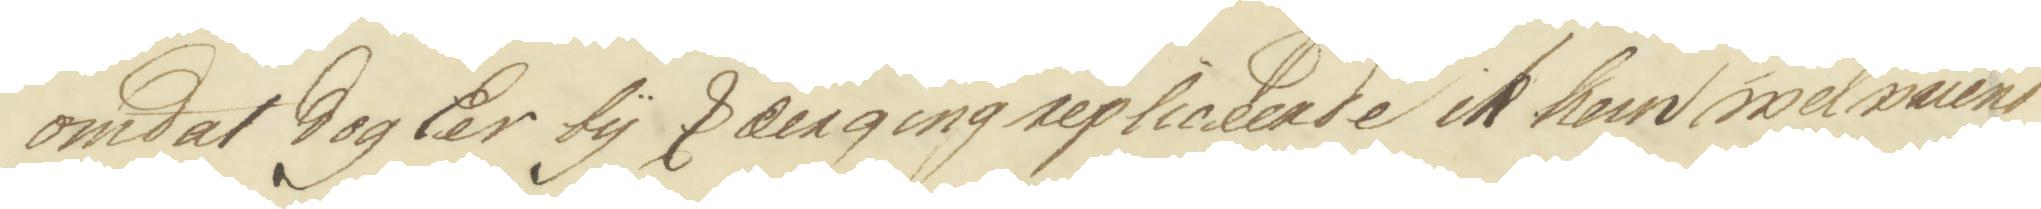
omdat dog Eer bij verder ging repliceerde ik hem wel vriend
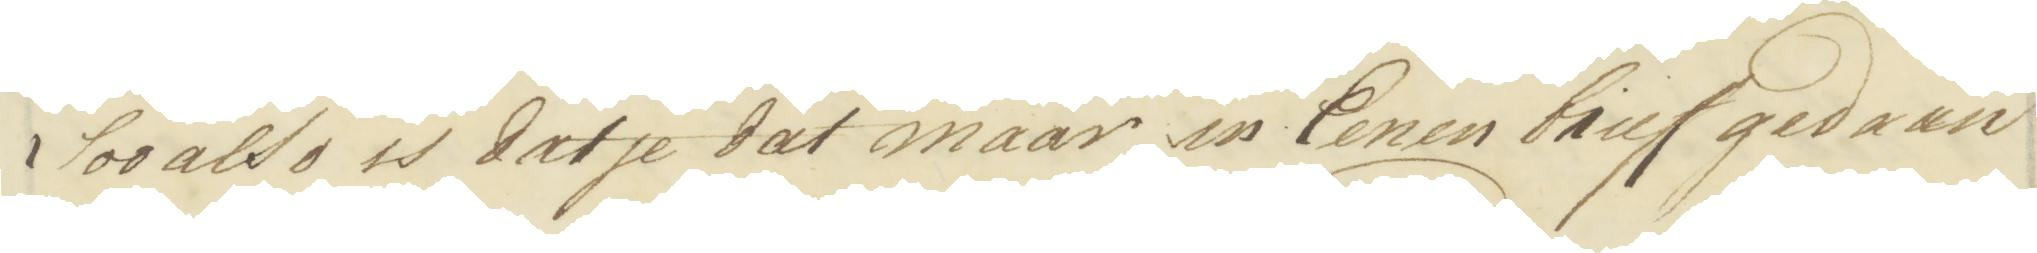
soo also is dat je dat maar in Eenen brief gedaan
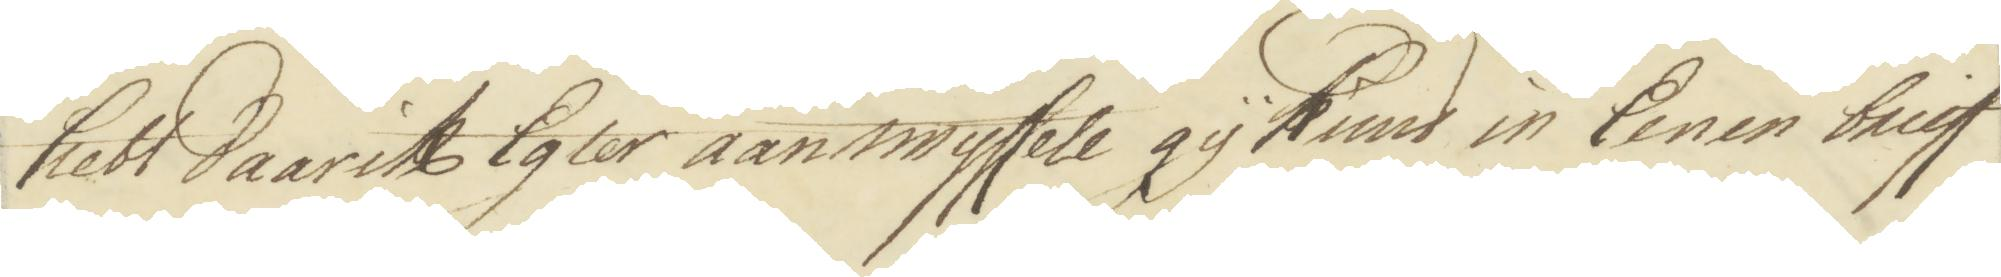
hebt daar ik Egter aan wyffele gij kund in Eenen brieff
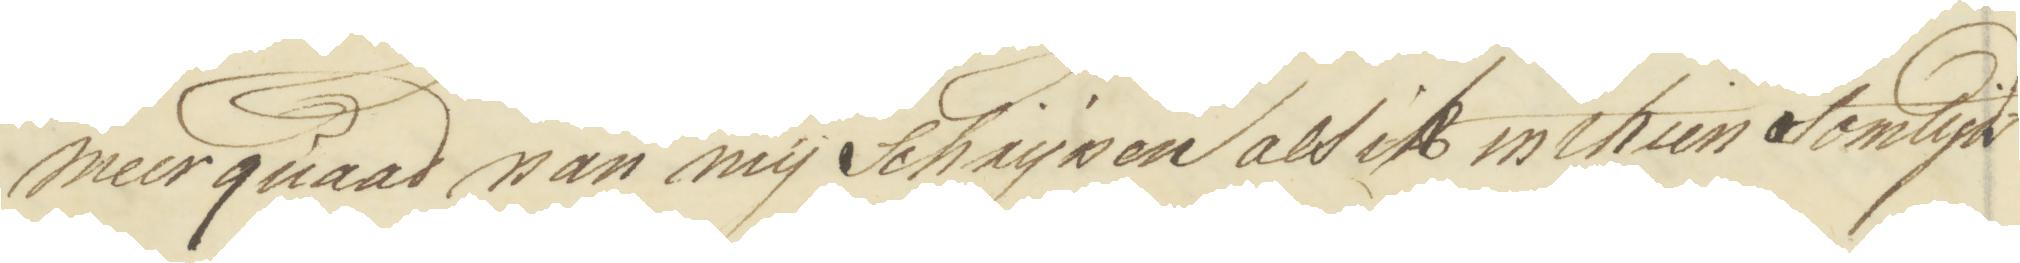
meer quaad van mij schrijven als ik in thien somtijds
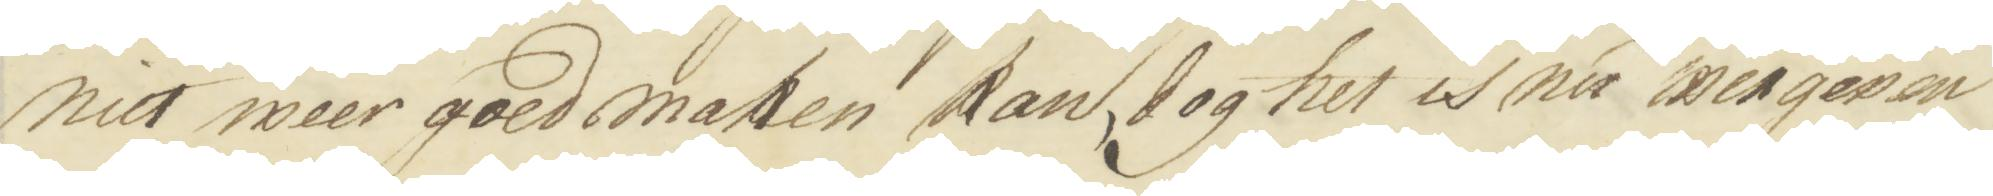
niet weer goed maken kan, dog het is nu vergeven
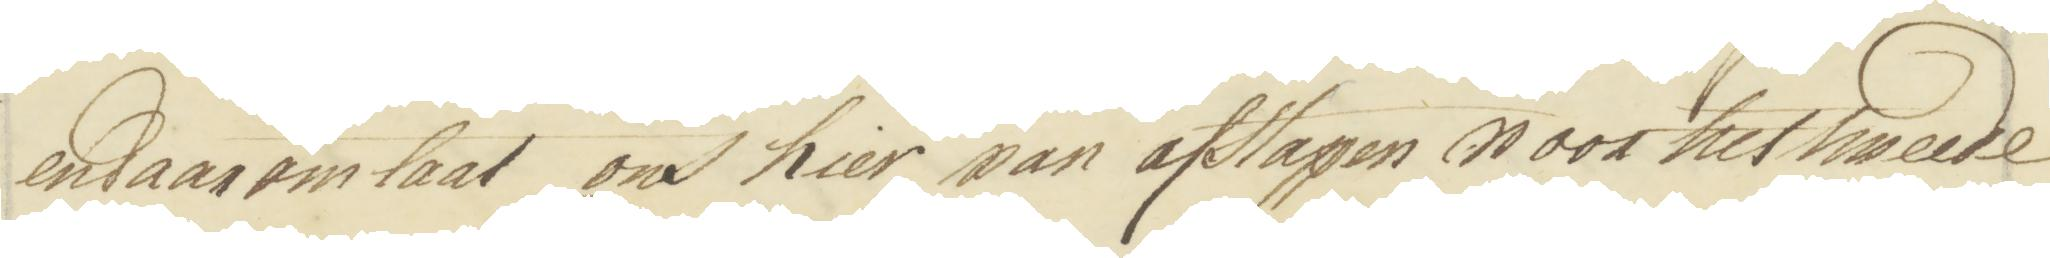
en daar om laat ons hier van afstappen voor het tweede
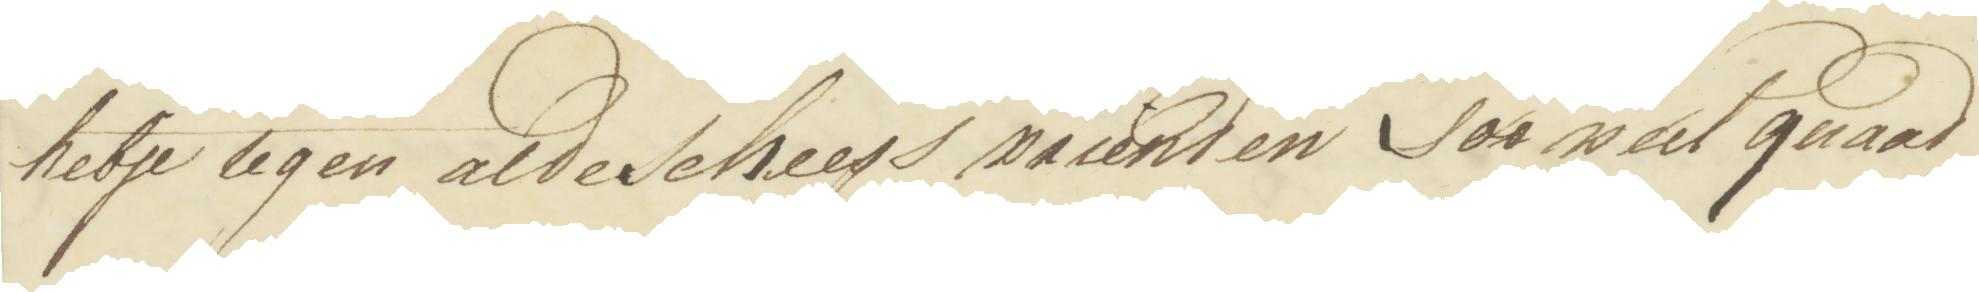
hebje tegen aldescheeps vrienden soo veel quaad
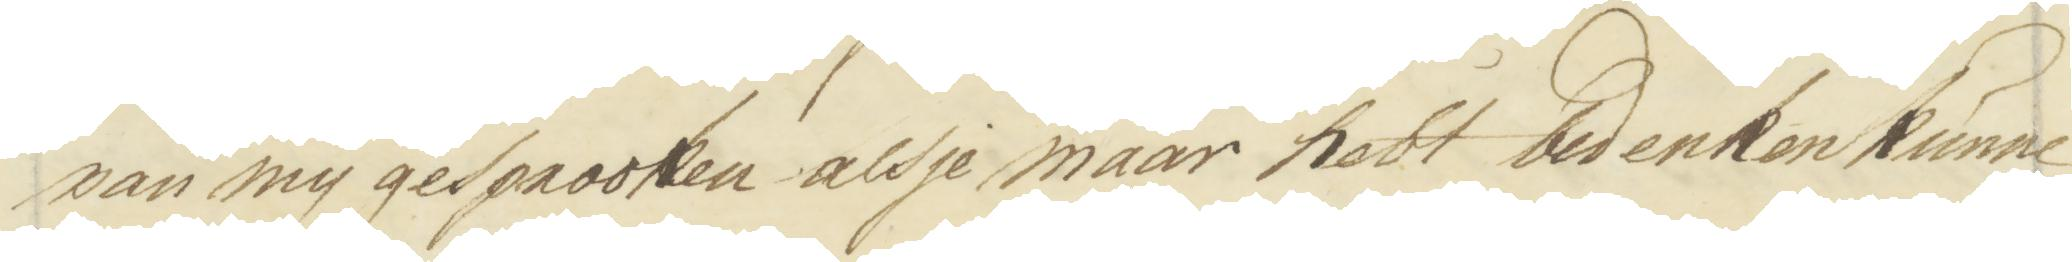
van mij gesprooken alsje maar hebt bedenken kunne,
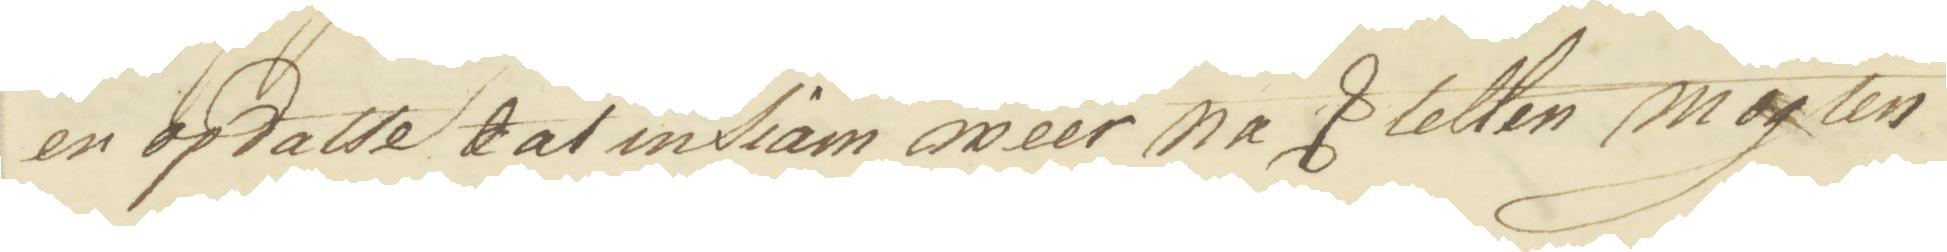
en op datse dat in siam weer na vertellen mogten
